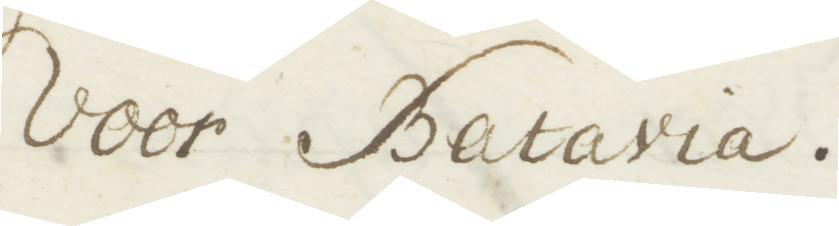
Voor Batavia.
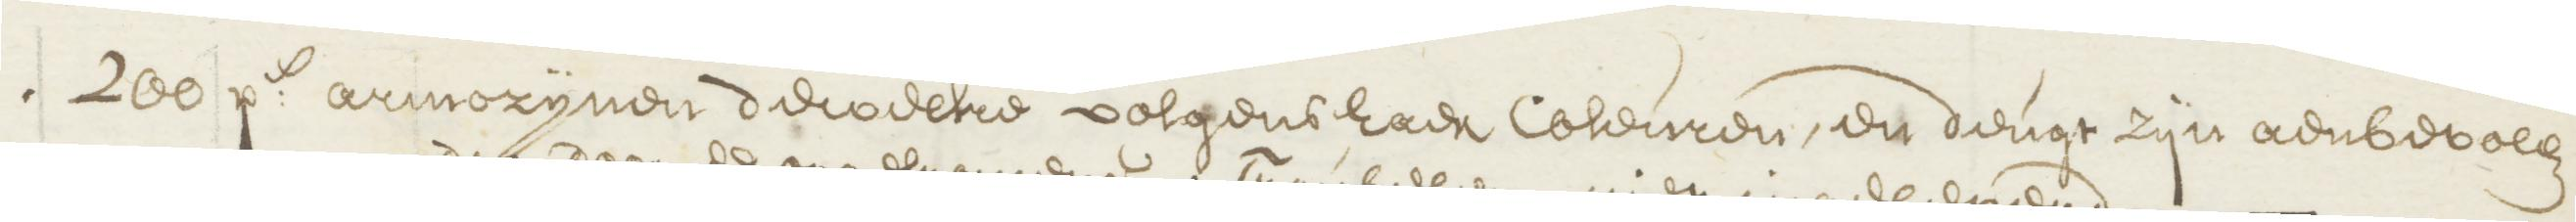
. 200 p:s armozijnen dewelke volgens haer coleuren, en deugt zijn aenbevolen
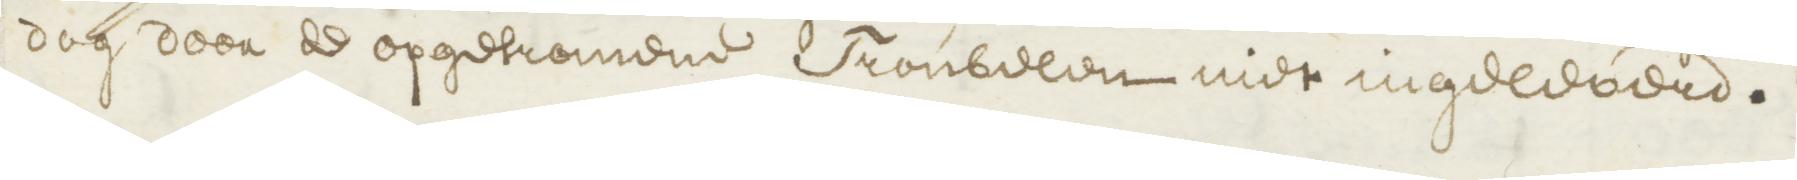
dog door de opgekomene Troubelen niet ingeleverd.
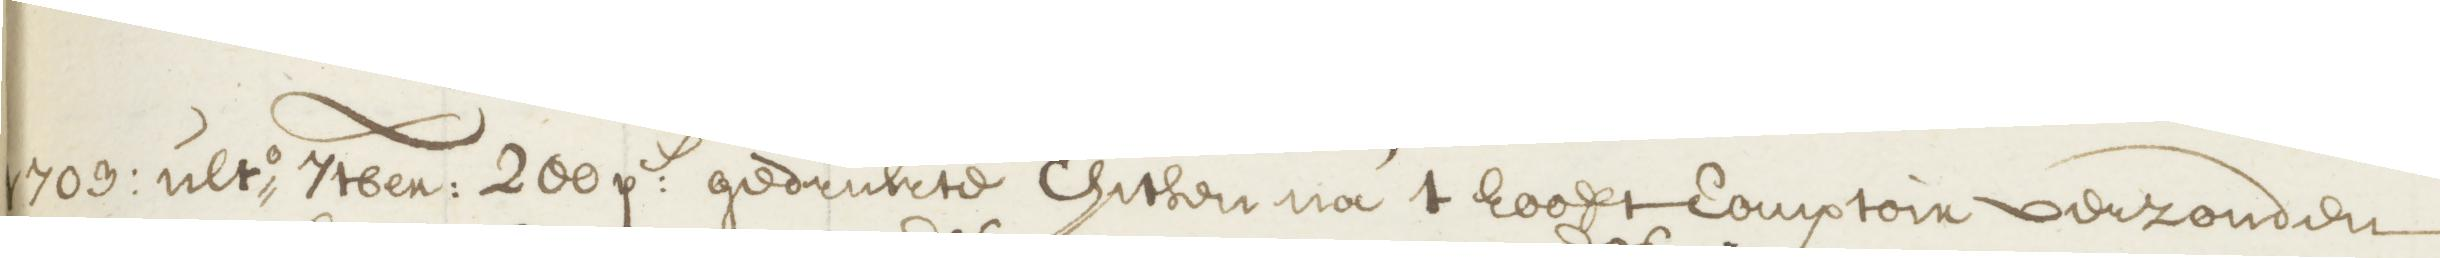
1703: ult„o 7tber: 200 p:s gedrukte Chitsen na ’t hooft Comptoir verzonden
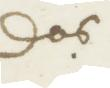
_.os
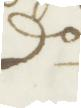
_os
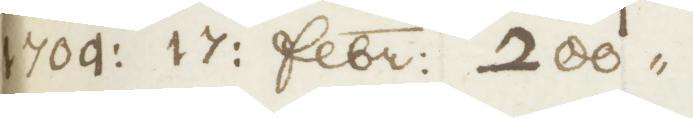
1704: 17: febr: 200 „
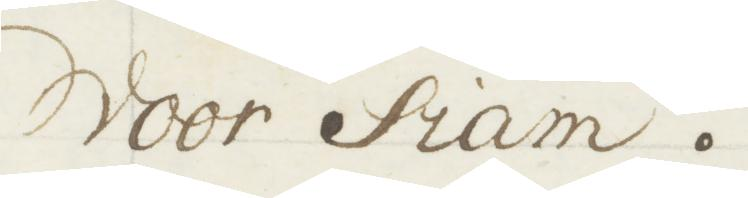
Voor Siam .
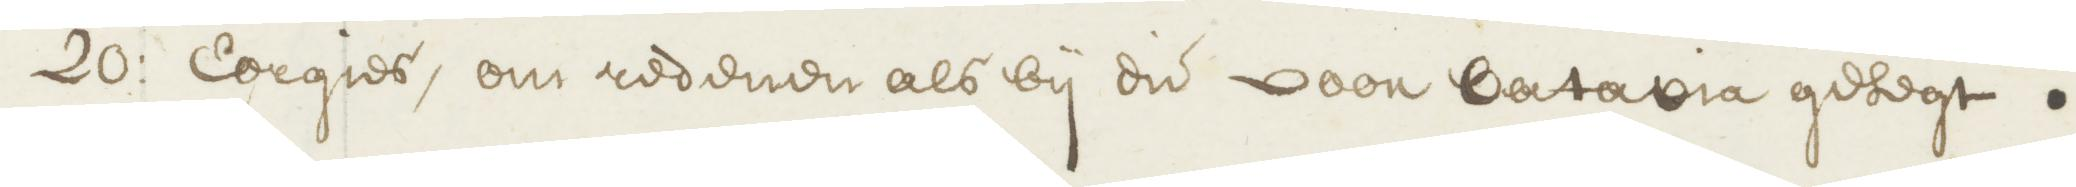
20: Corgies, om redenen als bij die voor batavia gesegt.
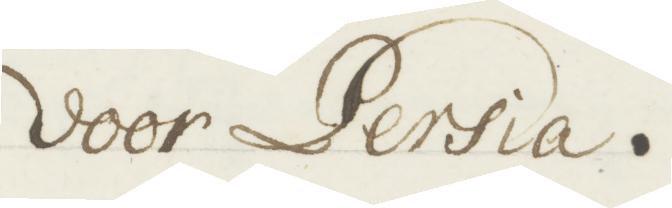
voor Persia.
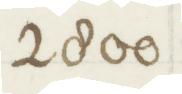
2800
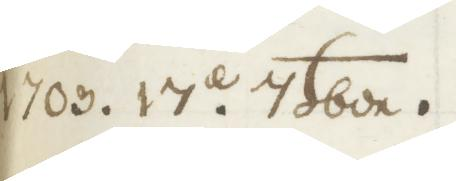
1703. 17.e 7tber.
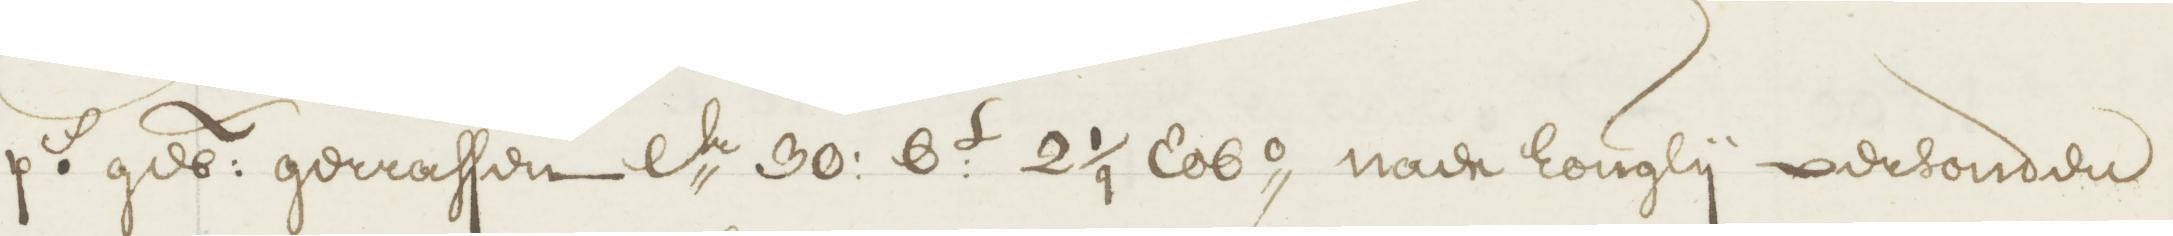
p.s geb: gerrassen l„k 30: b:t 2¼ Eob„o naer houglij versonden
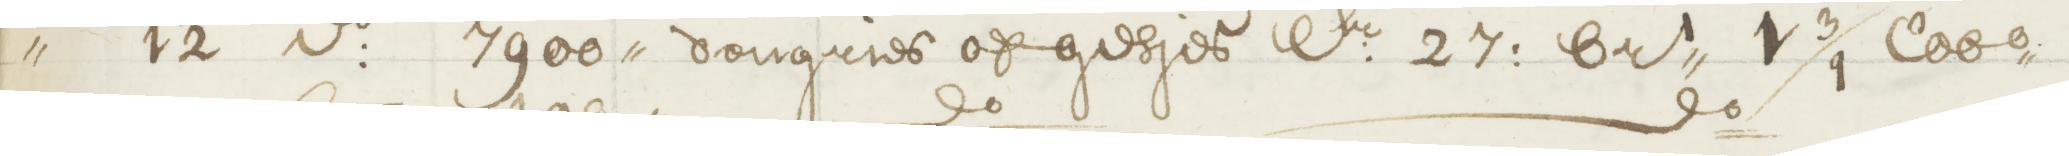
„ 12 d:o 7900 „ dongries of gesjes l:k 27: br„t 1 3/4 Eob„o
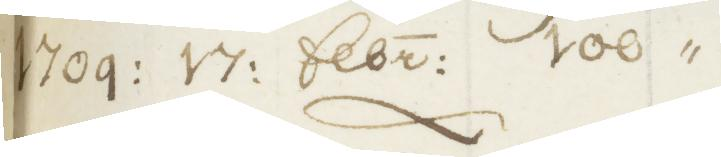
1704: 17: febr: 100„
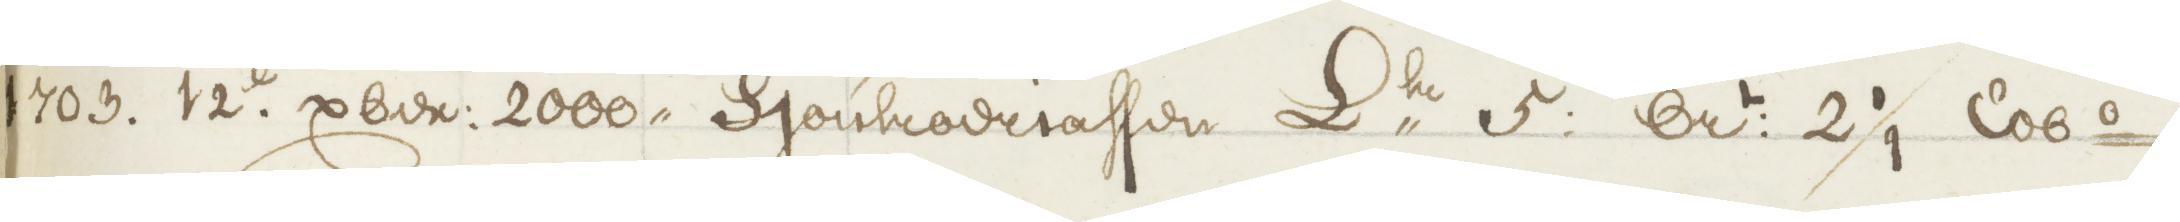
1703. 12.e xber: 2000„ Sjoukoeriassen L„k 5: br:t 2¼ Eob=o
